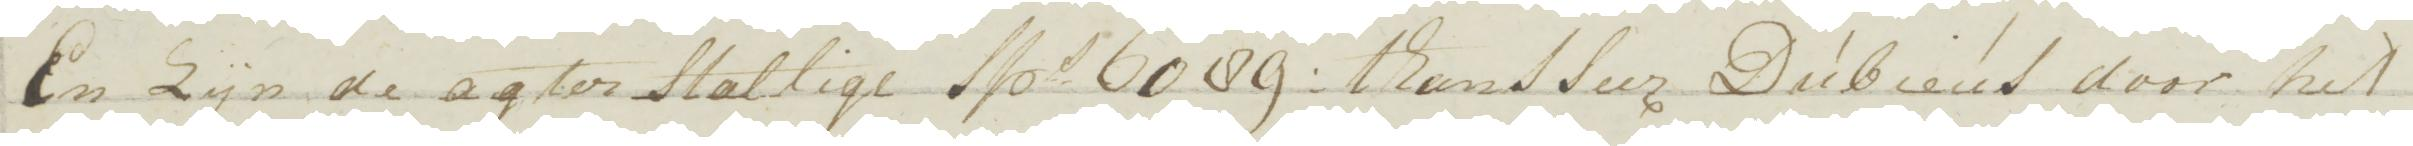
En zijn de agterstallige sp=s 6089: thans seer Dubieus door het
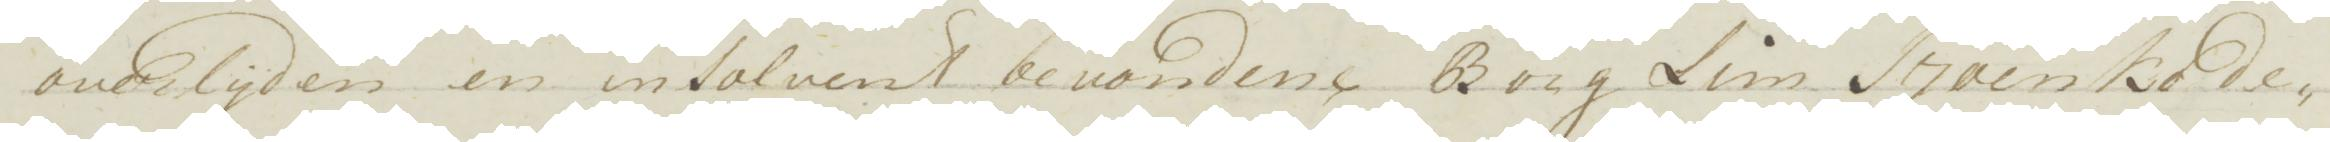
overlijden en insolvent bevondene Borg Lim Tjoenke de„
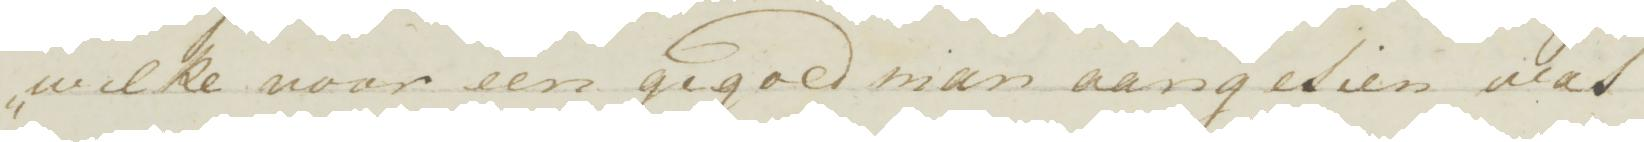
„welke voor een gegoed man aangesien was
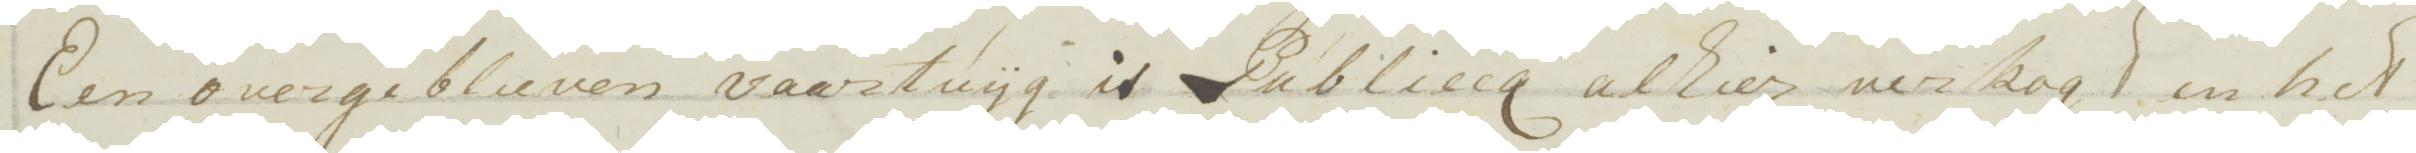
Een overgebleeven vaartuijg is Publiecq alhier verkogt en het
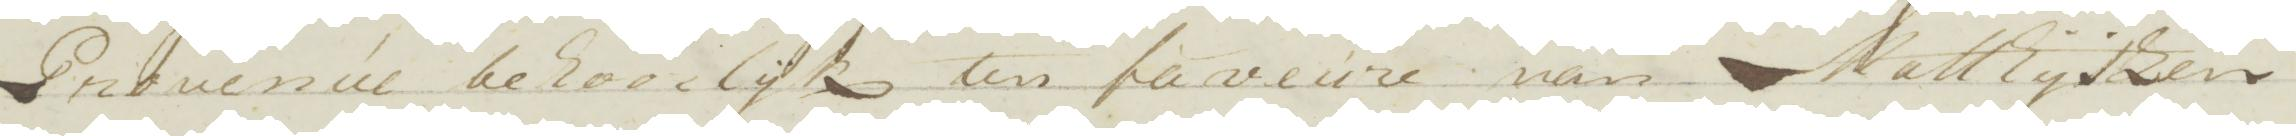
Provenue behoorlijk ten faveure van Matthijszen
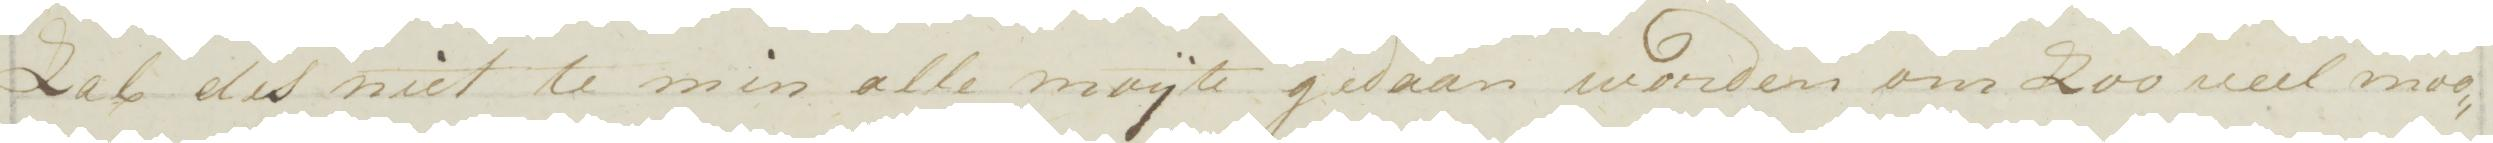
zal des niet te min alle moijte gedaan worden om zoo veel moo„
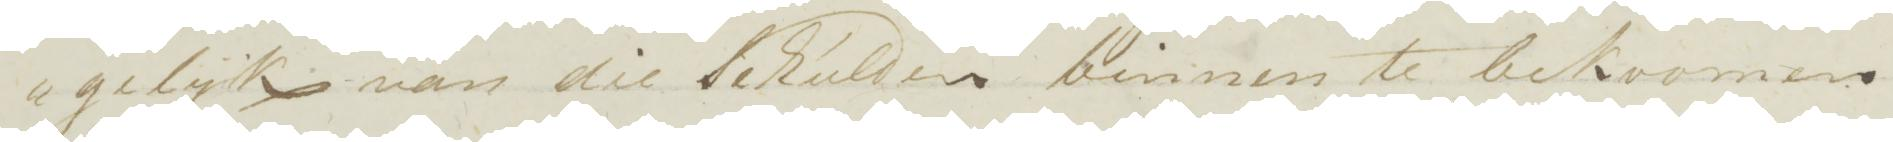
gelijk van die schulden binnen te bekoomen
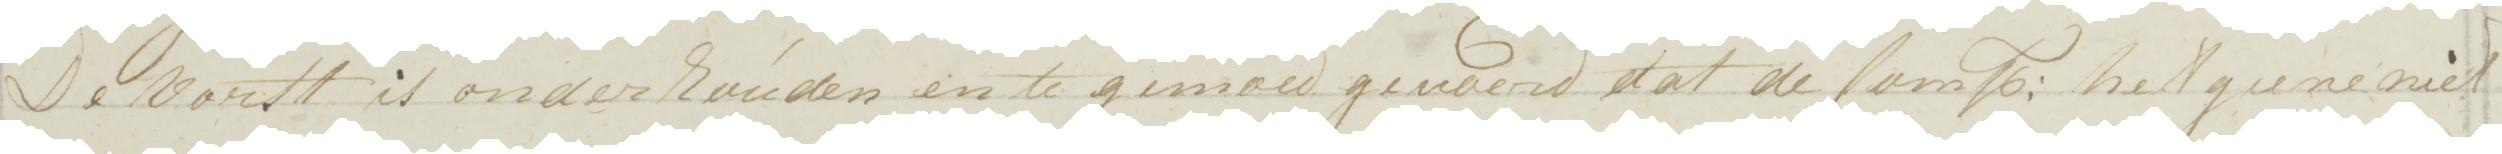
De vorst is onderhouden en te gemoed gevoerd dat de Comp: het geene niet
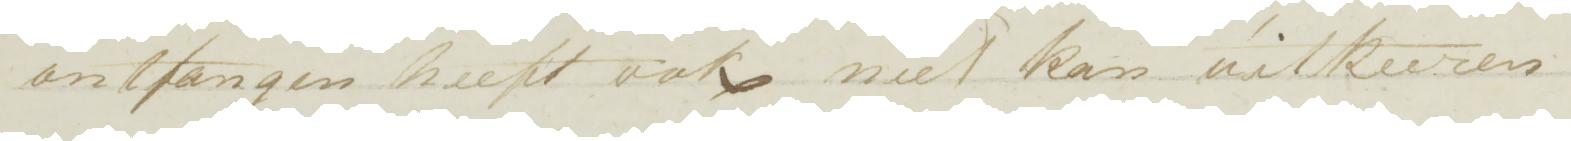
ontfangen heeft ook niet kan uitkeeren
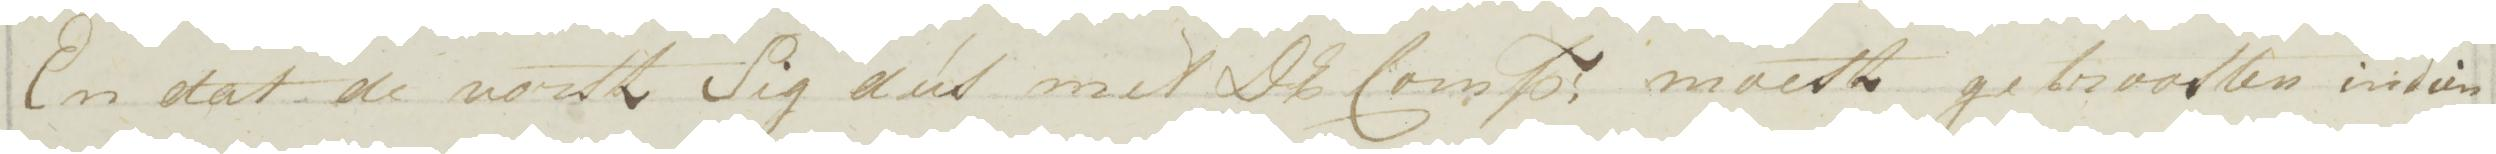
En dat de vorst sig dus met DE Comp:s moest getroosten indien
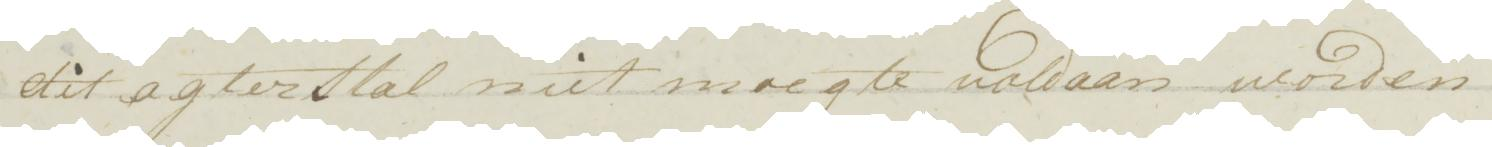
dit agterstal niet moegte voldaan worden
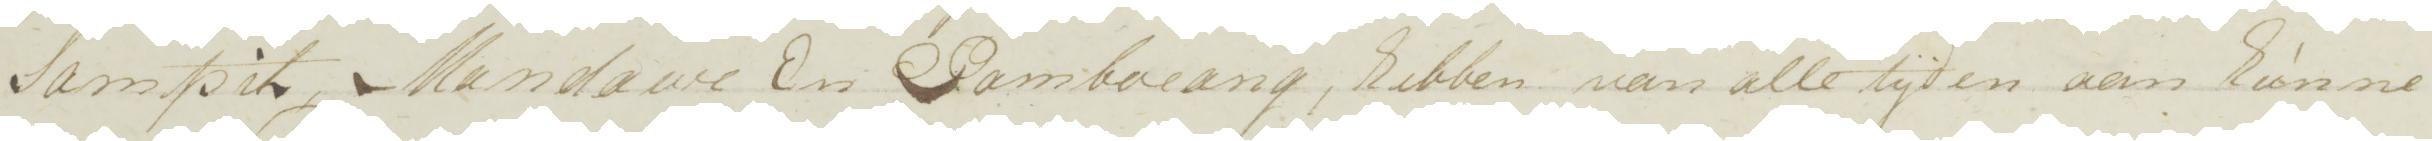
Sampit, Mandawe En Pamboeang, hebben van alle tijden aan hunne
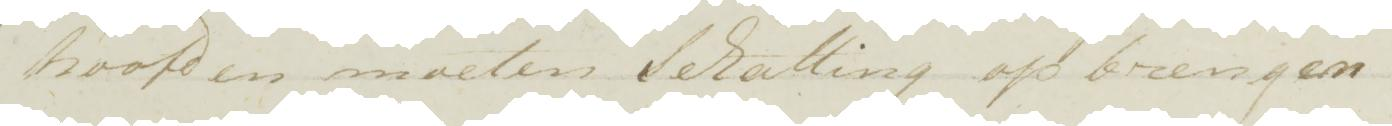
hoofd en moeten schatting op brengen
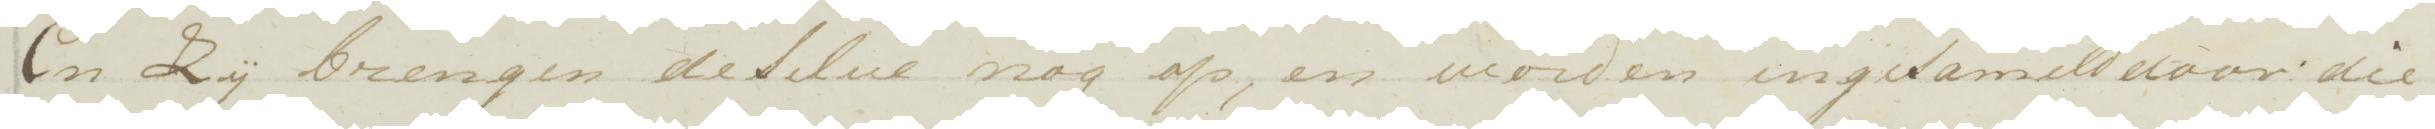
En zij brengen deselve nog op, en worden ingesameld door die
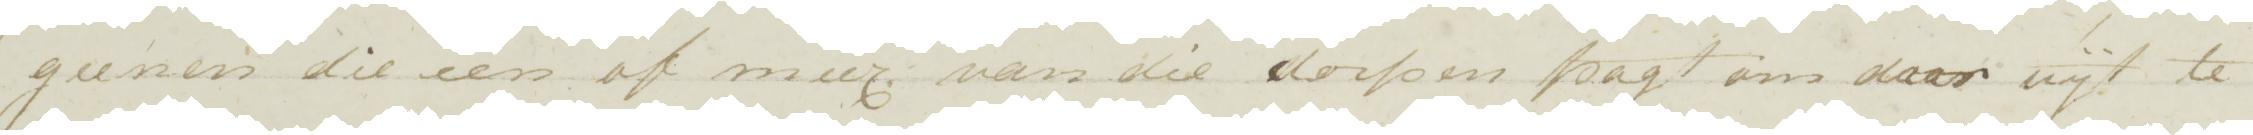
geenen die een of meer van die dorpen pagt om daar uijt te
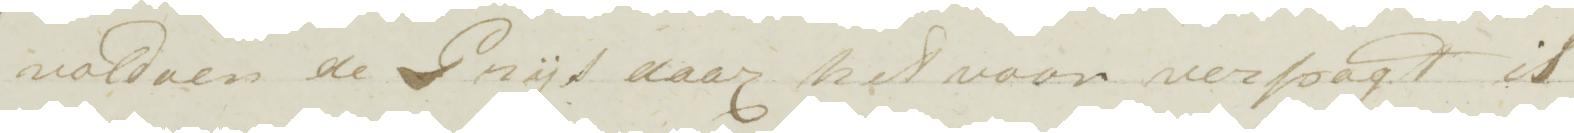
voldoen de Prijs daar het voor verpagt is
